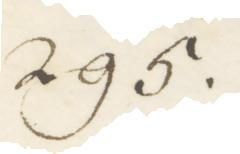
295.
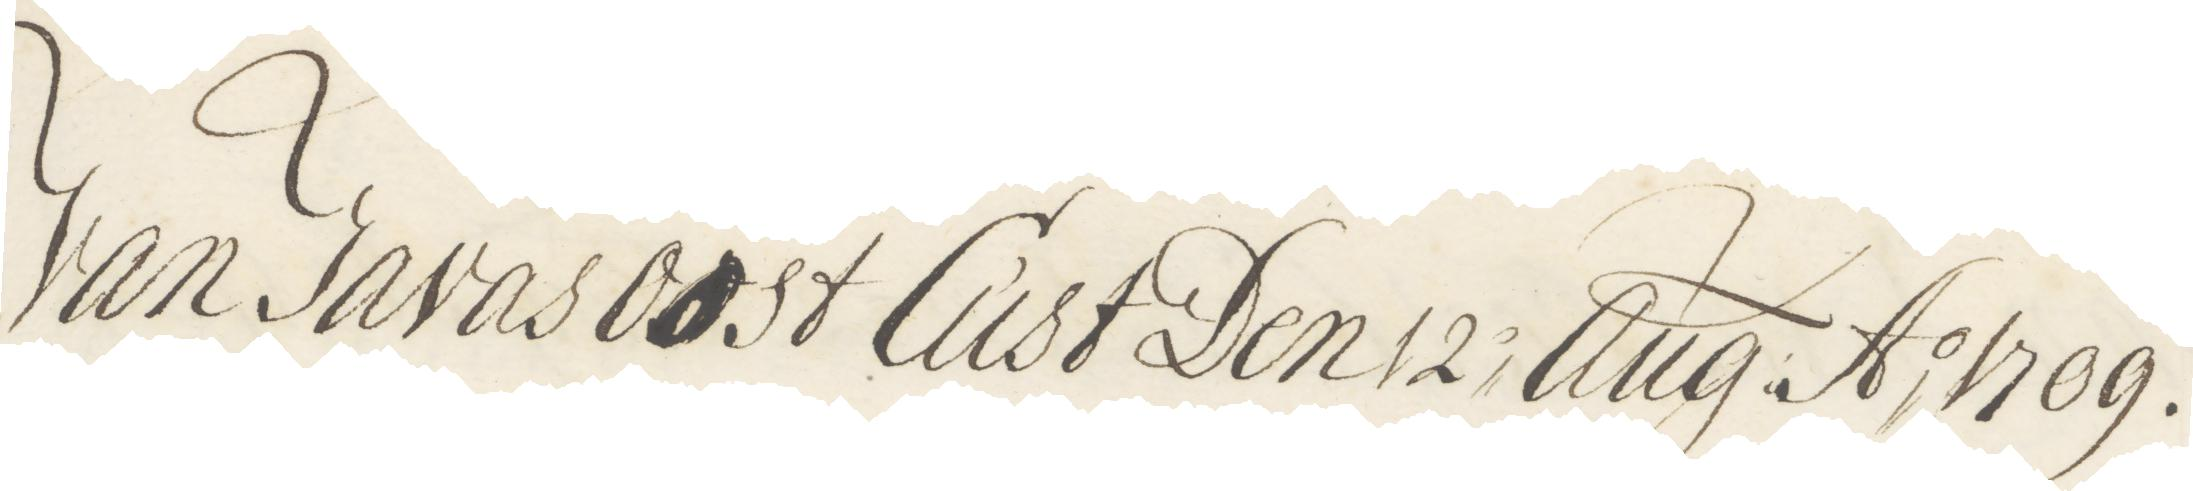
Van Iavas oost Cust Den 12„' aug: A„o 1709.
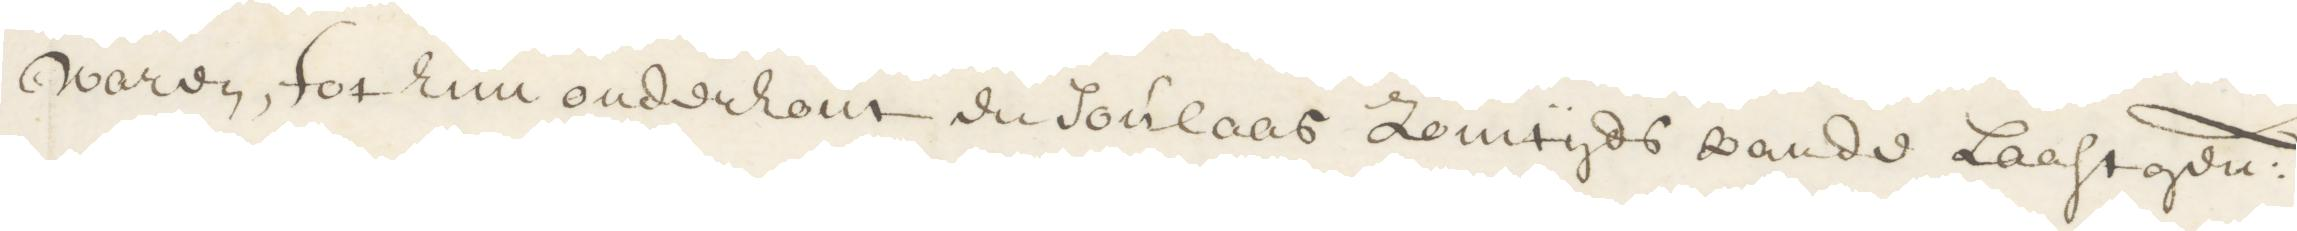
waren, tot hun onderhout en soulaas zomtijds van de laast gen:
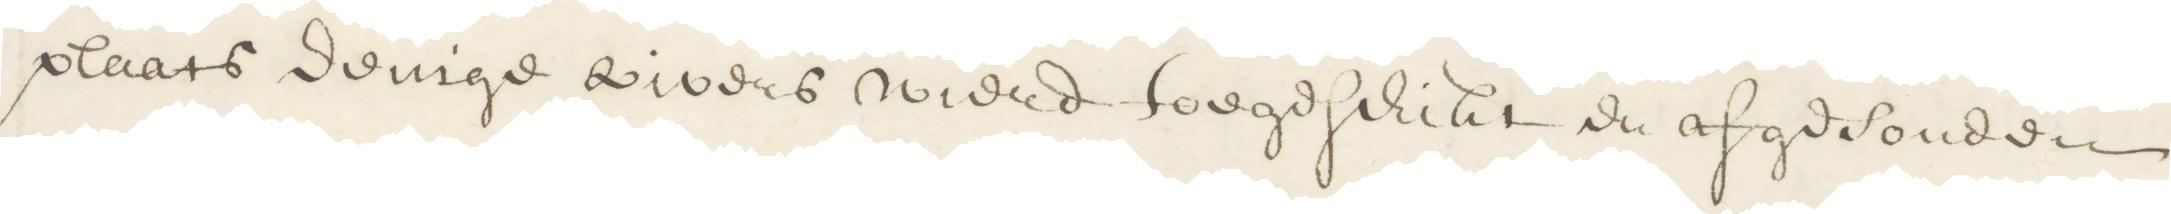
plaats Eenige vivers wierd toegeschikt en afgesonden
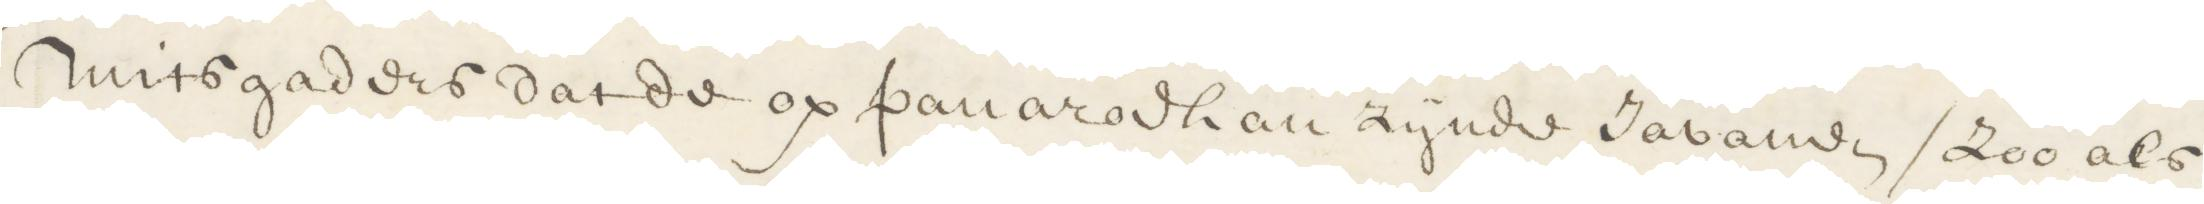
mitsgaders dat de op panaroekan zijnde Iavanen / zoo als
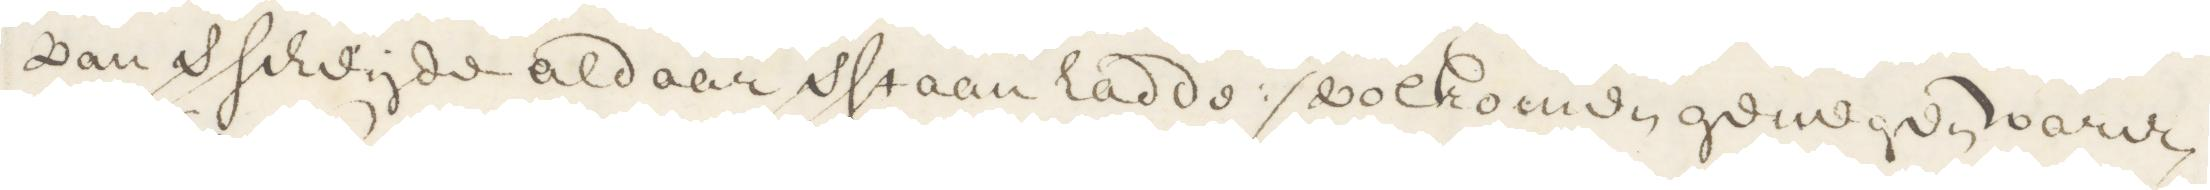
van verscheijde aldaar verstaan hadde :/ volkomen genegen waren
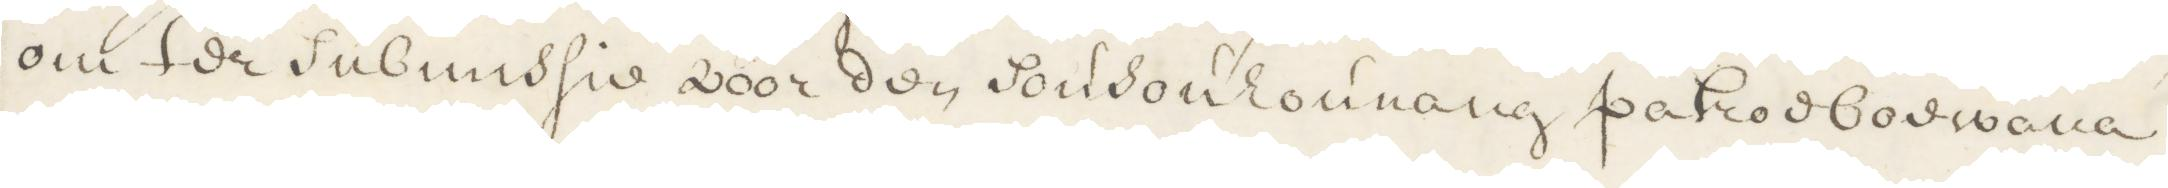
om ter submissie voor den sousouhounang pakoeboewana
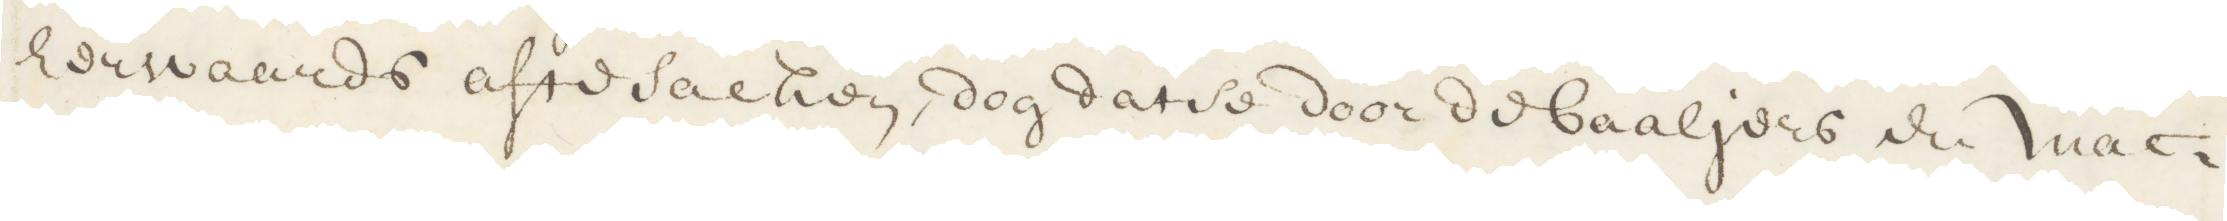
herwaards aftesacken, dog datse door de baaljers en mac=
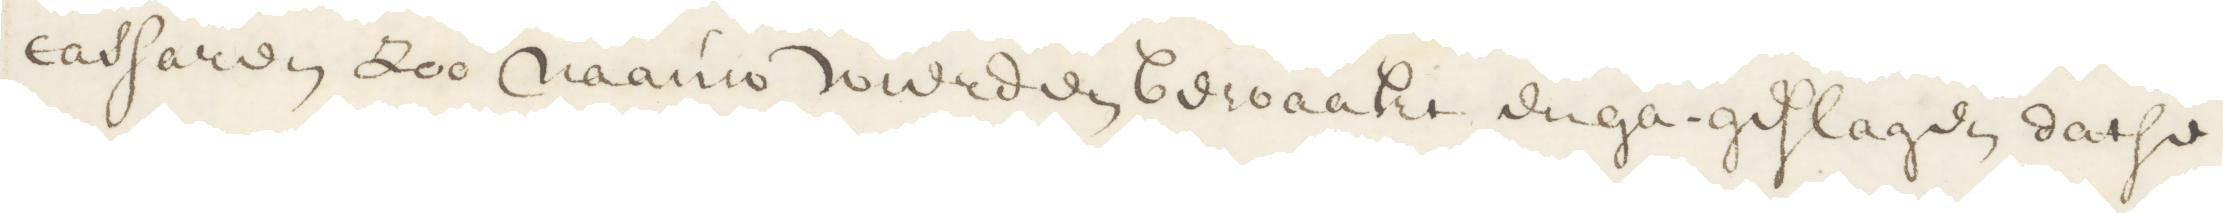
cassaren zoo naauw wierden bewaakt en ga-geslagen datse
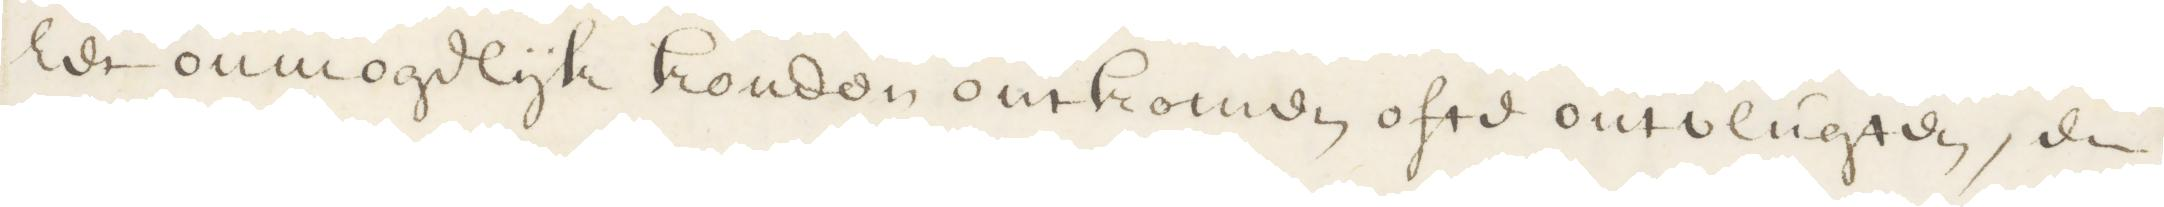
het onmogelijk konden ontkomen ofte ontvlugten, en
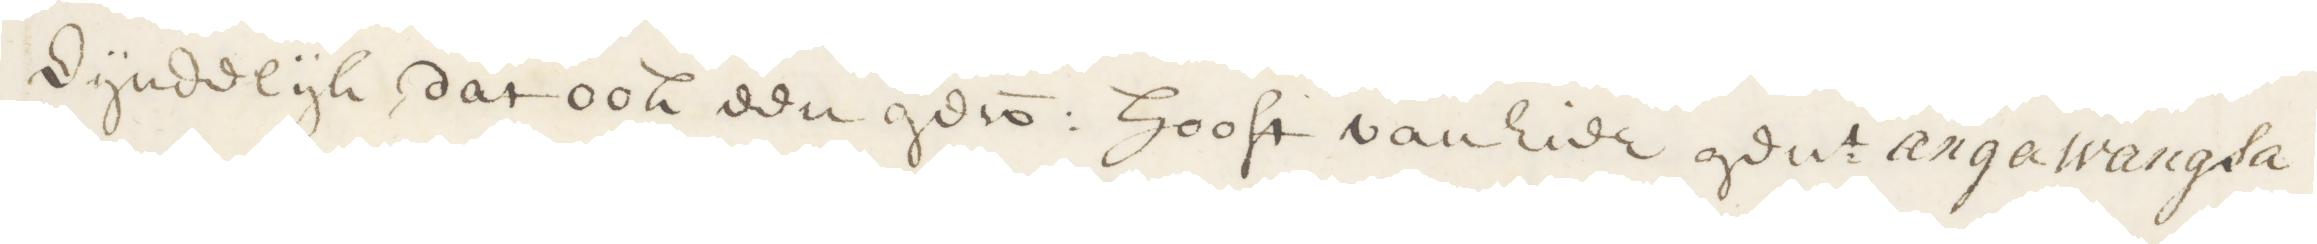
Eijndelijk, dat ook een gew: hooft van hier gen=t angawangsa
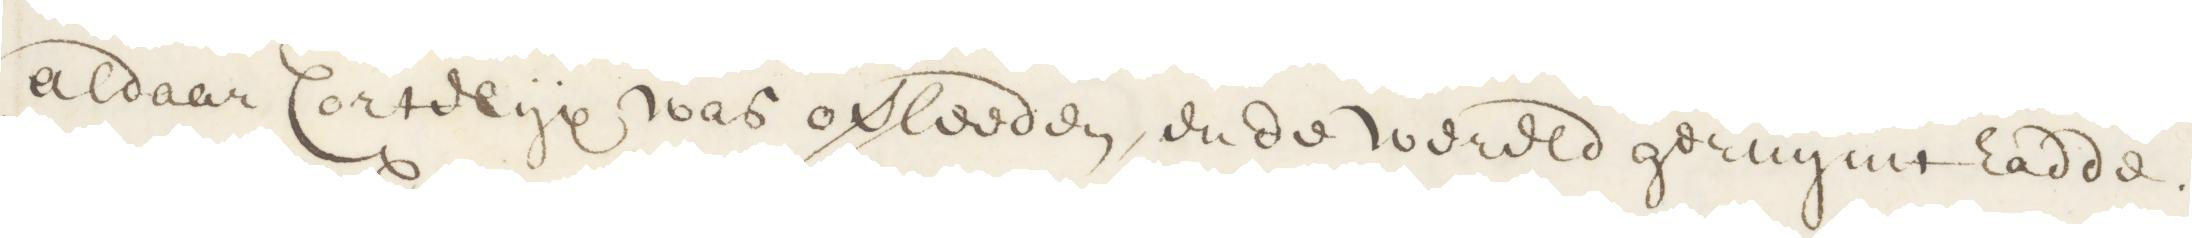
aldaar Cortelijx was overleeden, en de wereld geruijmt hadde.
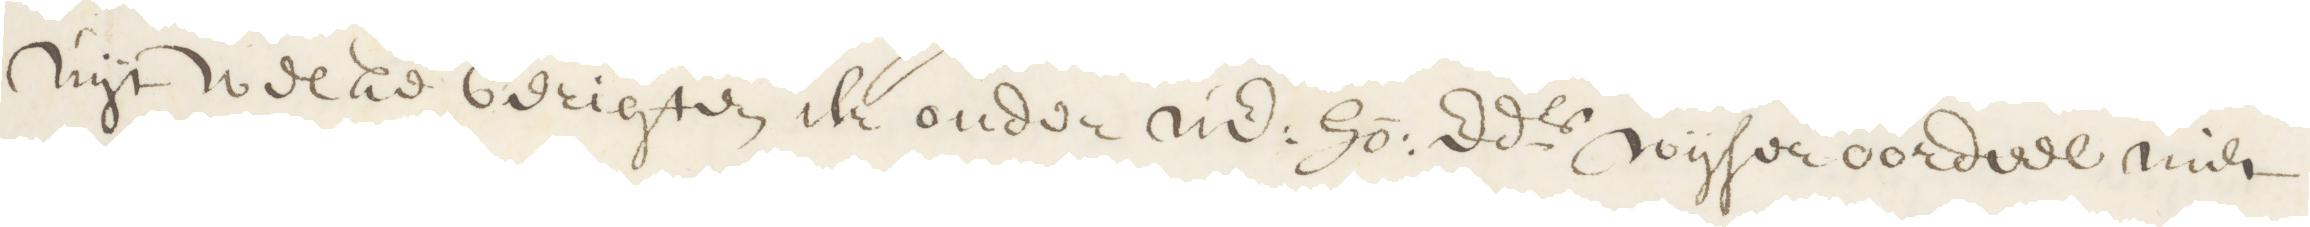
uijt welke berigten ik onder uE: Ho: Ed=ls wijser oordeel niet
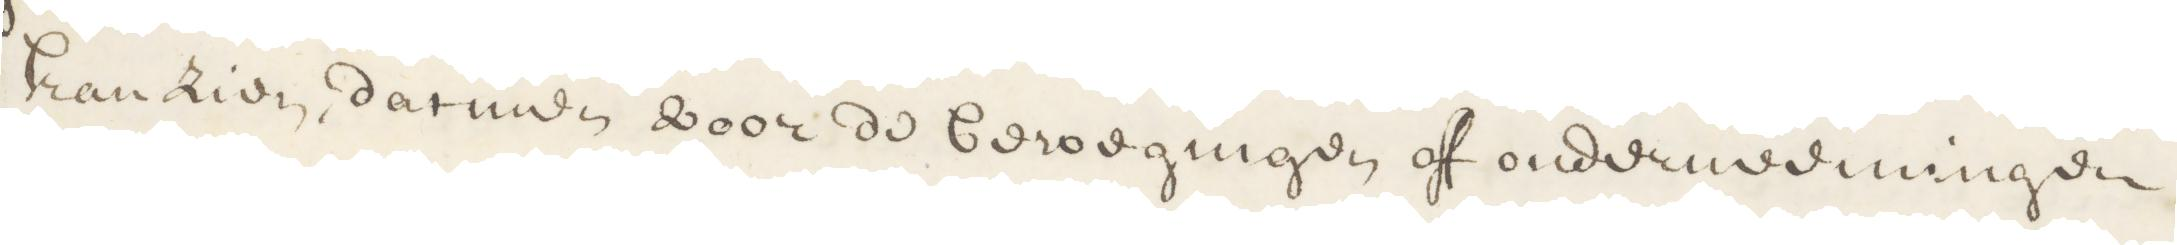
kan zien, dat men voor de bewegingen off onderneemingen
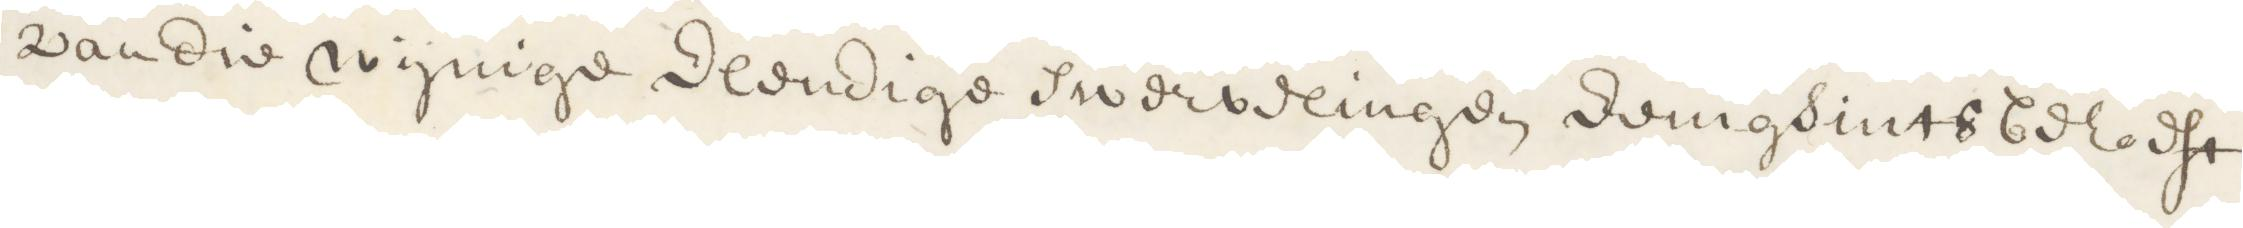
van die wijnige Elendige swervelingen Eenigsints behoeft
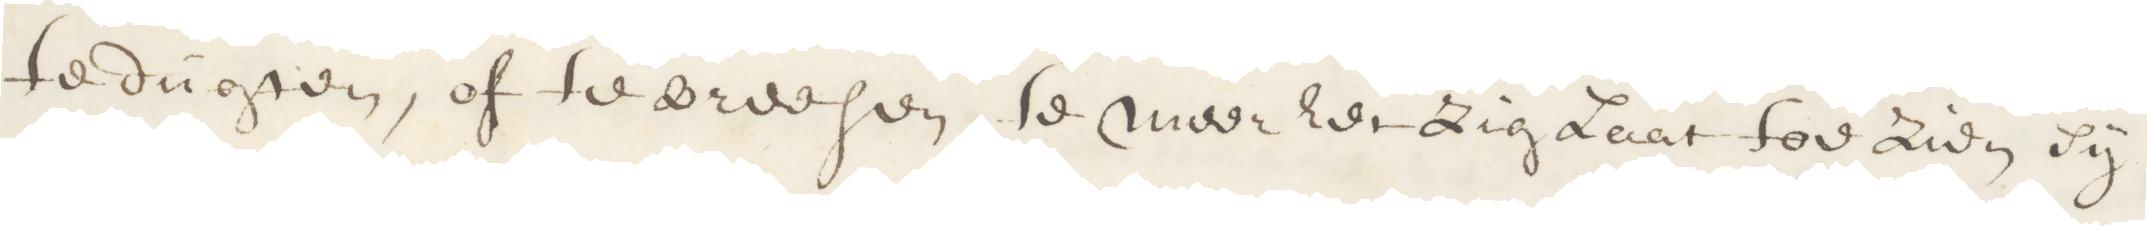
te dugten, of te vreesen, te meer het zig laat toe zien sij
